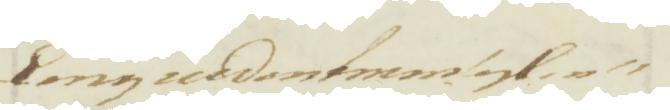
Een gulden twintig Cents.
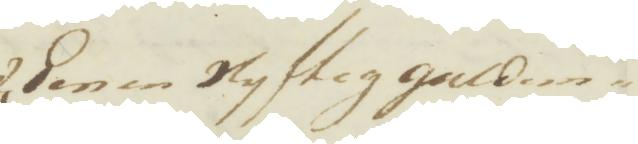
Een en Vyftig guldens
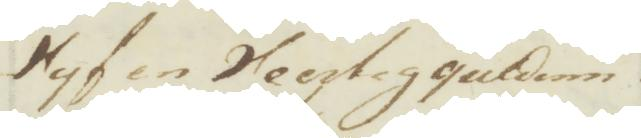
Vyf en Veertig guldens
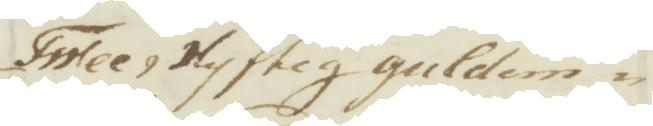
Twee & vyftig guldens
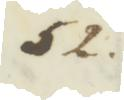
52.
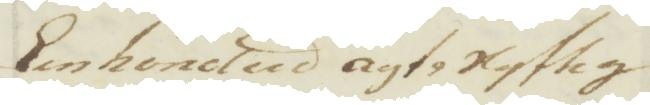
Een honderd agt & vyftig
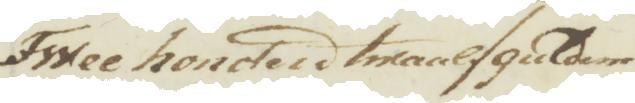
Twee honderd twaalf guldens
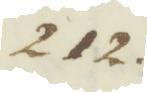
212.
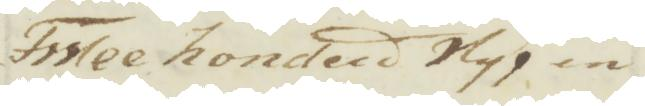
Twee honderd Vyf en
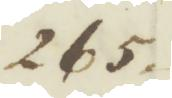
265.
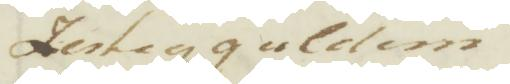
Zestig guldens
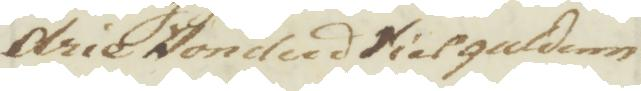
drie Honderd Vier guldens
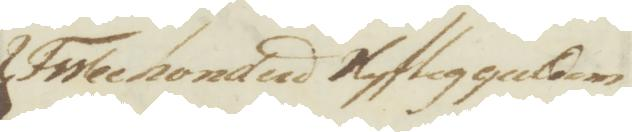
Twee honderd Vyftig guldens
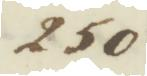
250
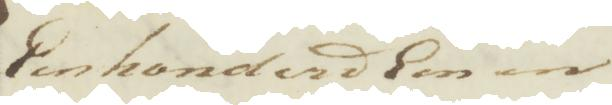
Een honderd Een en
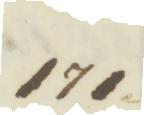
171.
